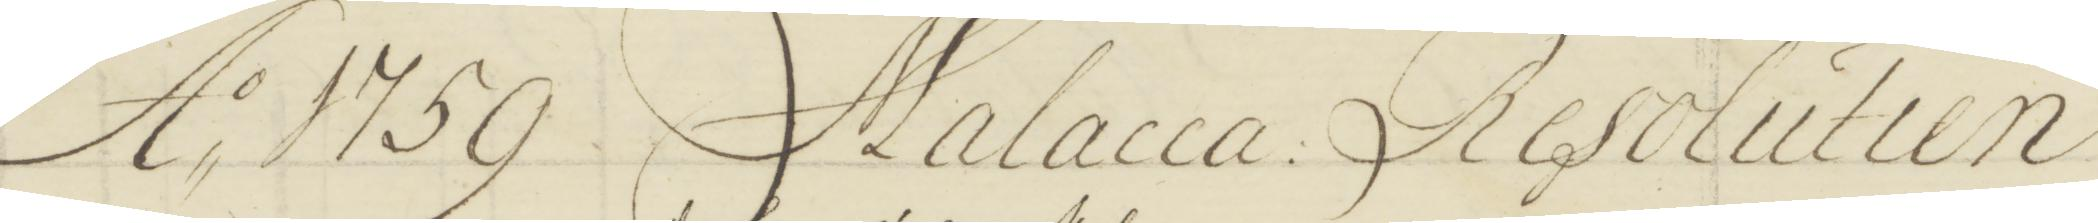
A„o 1759 Malacca: Resolutien
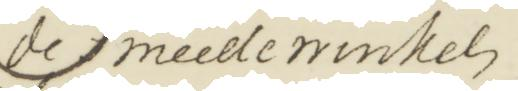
de smeede winkel
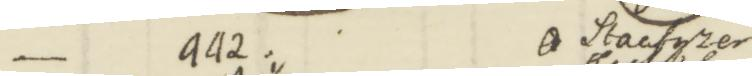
— 442. a staafyzer
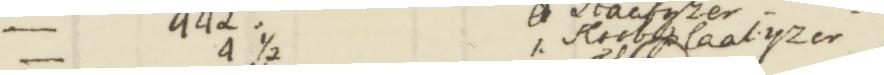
— 4½ „ Hoebplaatyzer
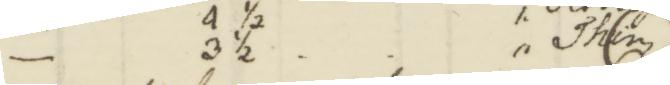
— 3½ - - „ Thin
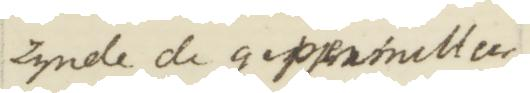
zynde de gepermitteer,
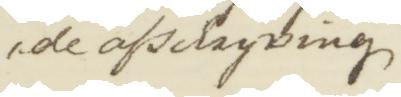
„de afschryving
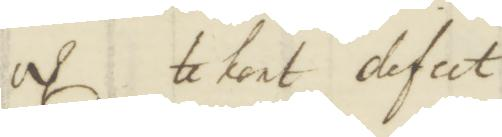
rx te kort defect
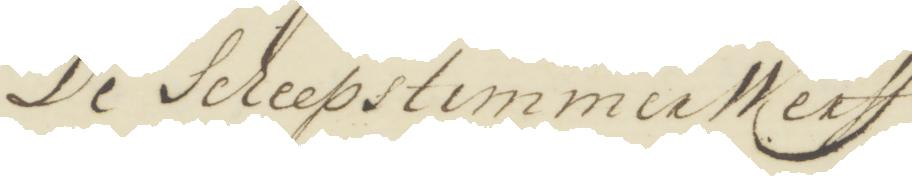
De scheepstimmerWerff
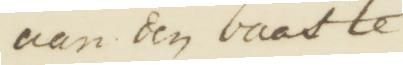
aan den baas te
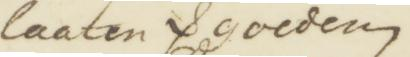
laaten vergoeden
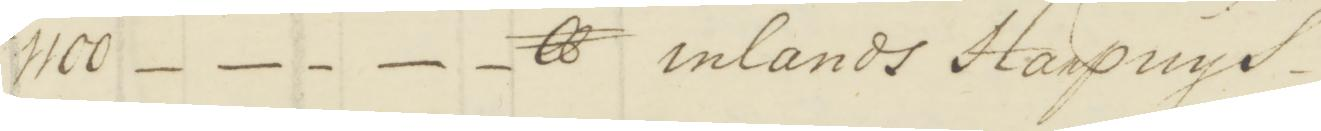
1100 _ _ _ _ _lb inlands Harpuijs_
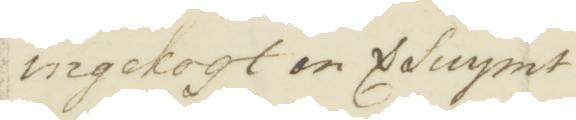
ingekogt en versuymt
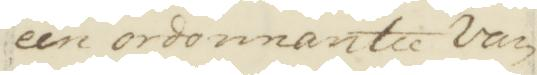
een ordonnantie van
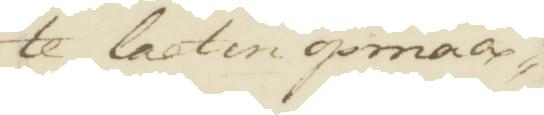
te laaten opmaa„
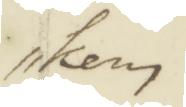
„ken
